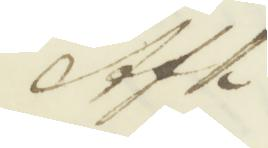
Afk
